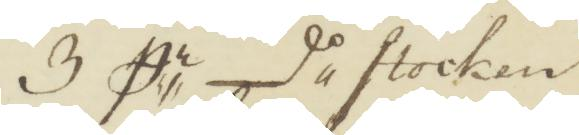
3 p„r _„o stocken
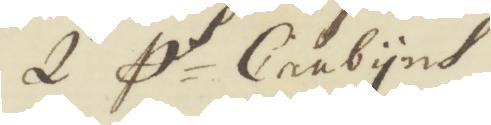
2 p=s Carbijns
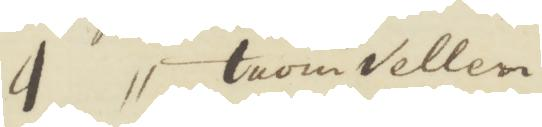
4 „ tromvellen
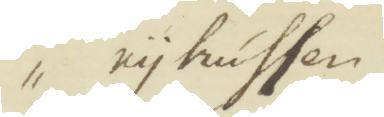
1 „ rijkussen
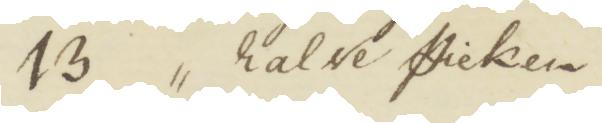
13 „ halve pieken
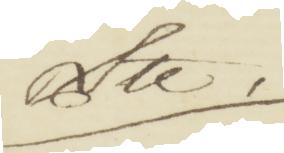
verte,
